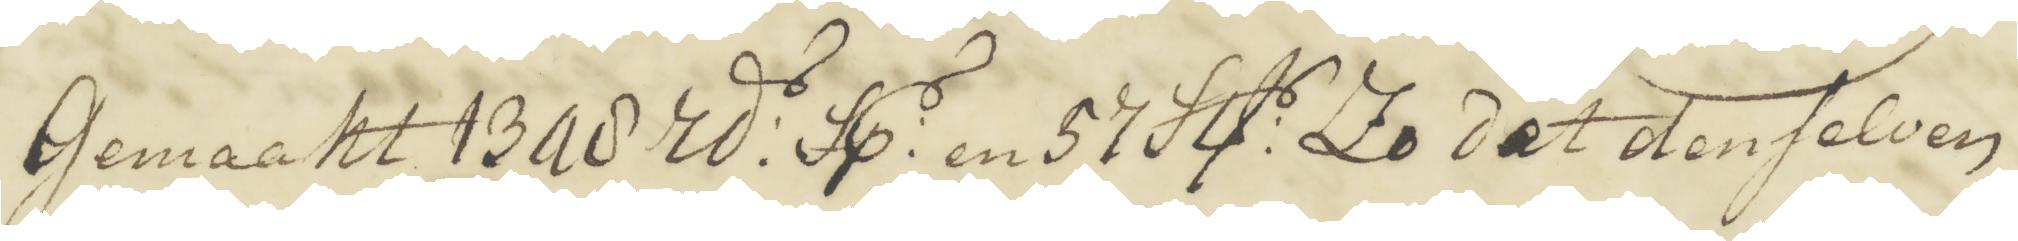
Gemaakt 1348 rd:s sp:s en 57 sp:s zo dat denselven
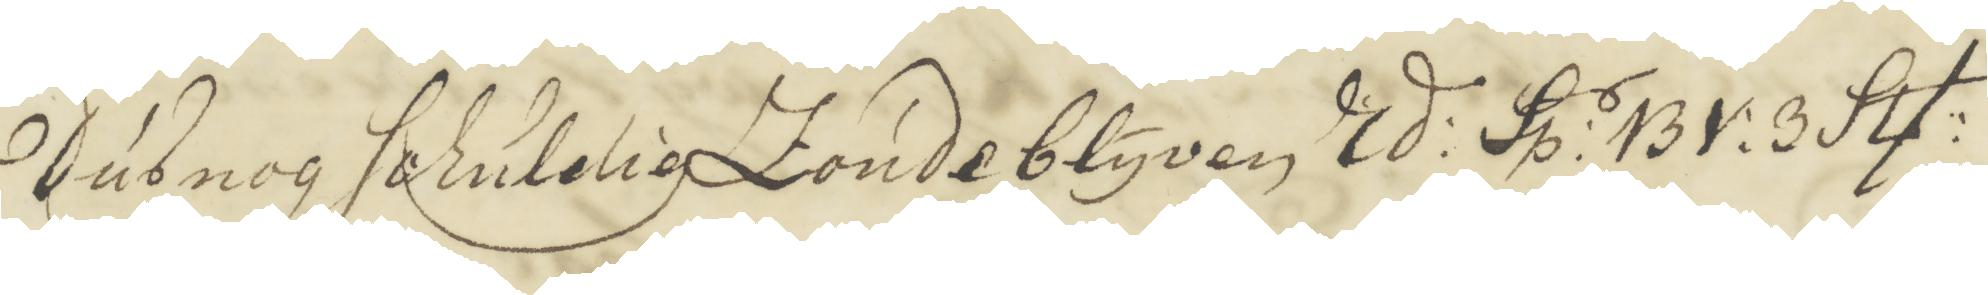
dus nog schuldig zoude blijven rd: Sp:s 131:3 Stver:s
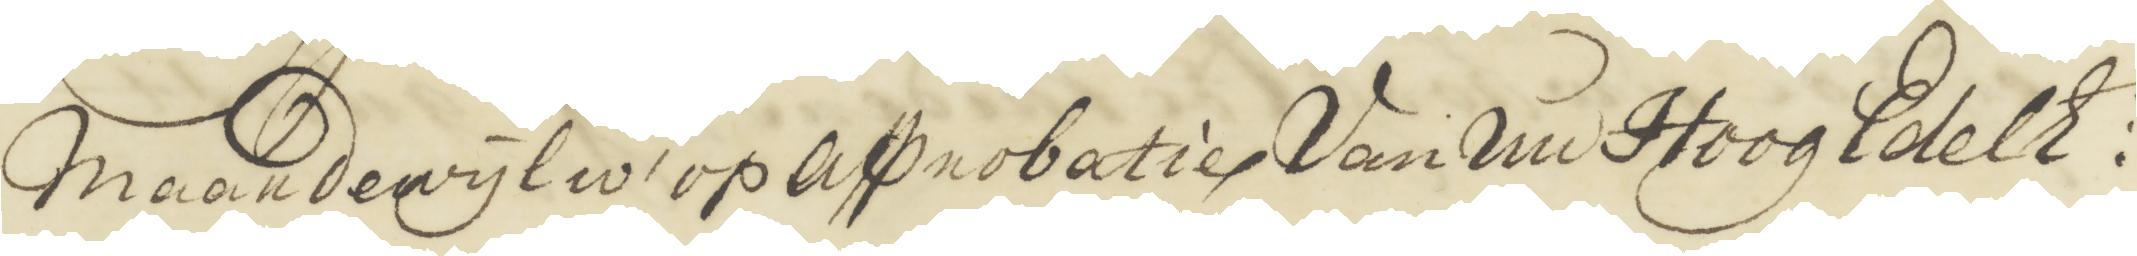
maar dewijl w' op approbatie Van uw Hoog Edelh:s
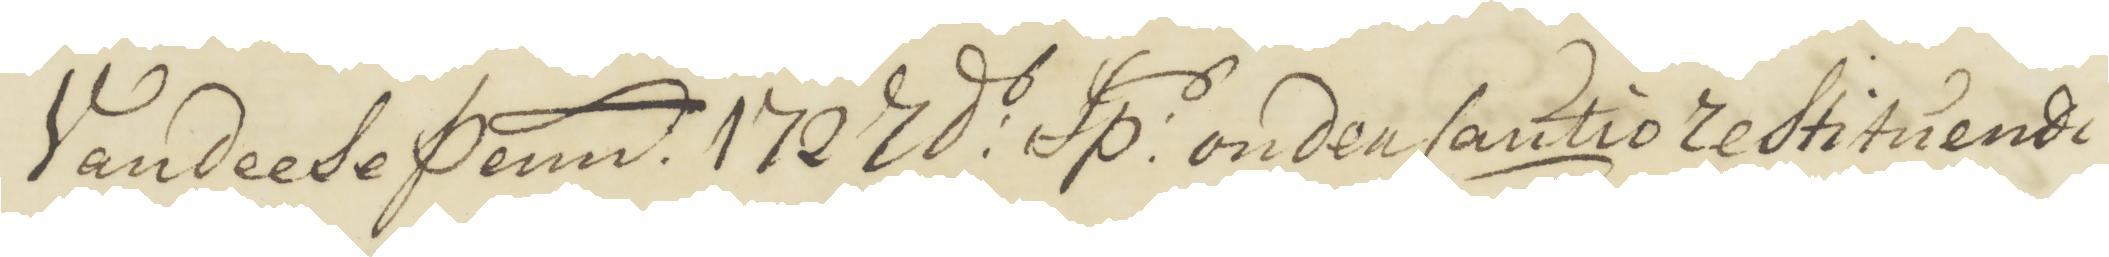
Van deese penn: 172 rd:s sp:s onder Cautio restituendi
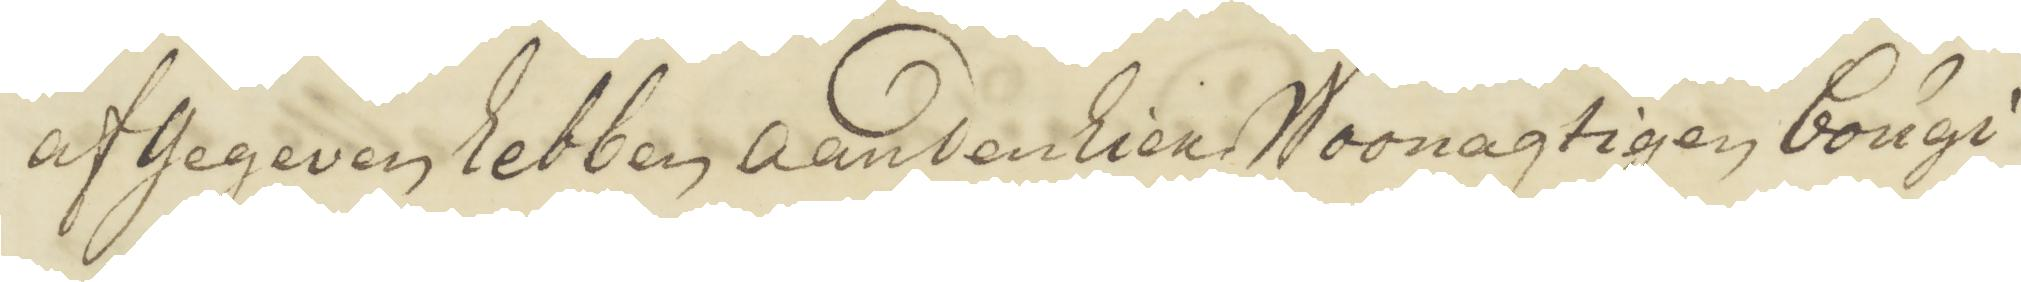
afgegeven hebben aan den hier Woonagtigen bougi
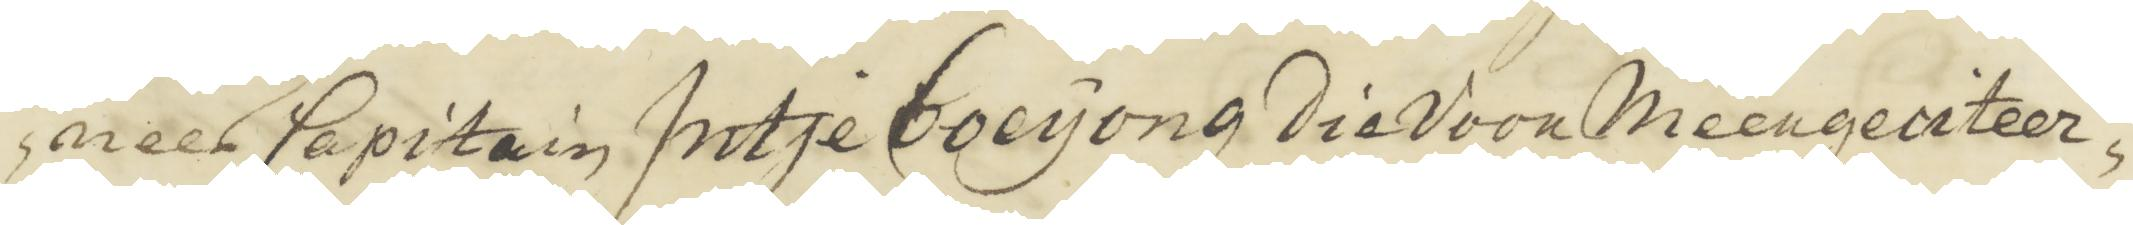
nees Capitain Jntje boeijong die voor meergeciteer„
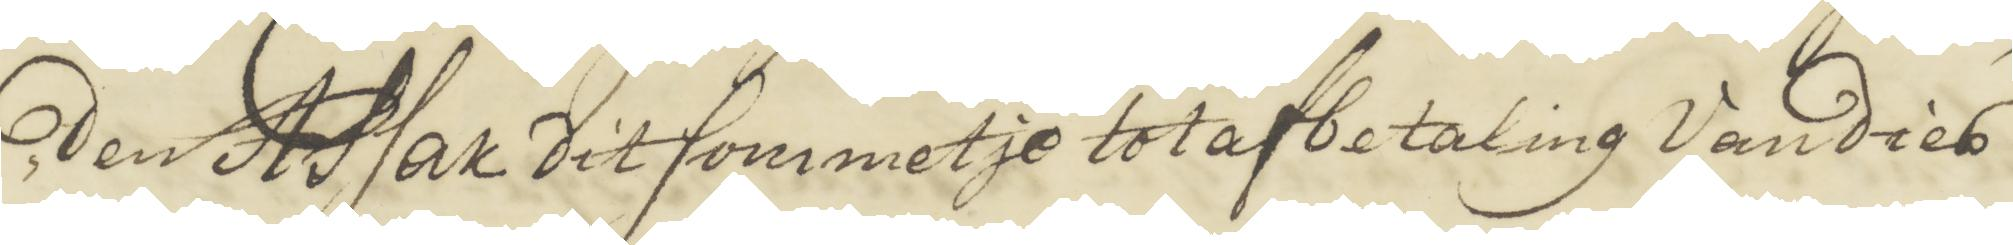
„den Assar dit sommetje tot afbetaling van dies
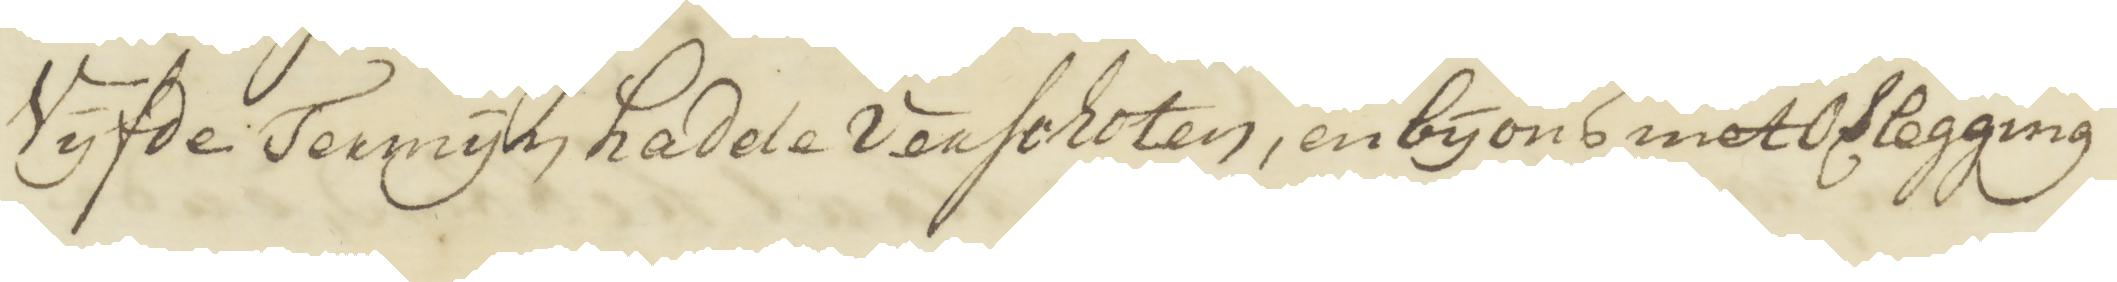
Vijfde Termijn hadde verschoten, en bij ons met overlegging
